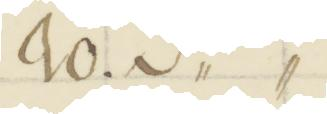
40. d„os „
